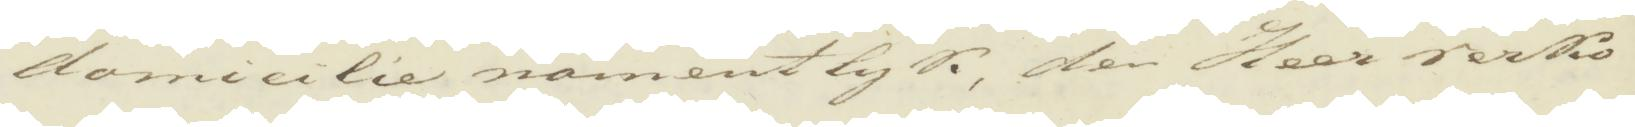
domicilie namentlijk, den Heer verko
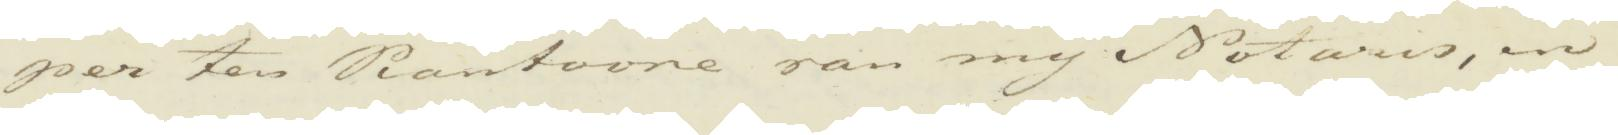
per ten Kantoore van my Notaris, in
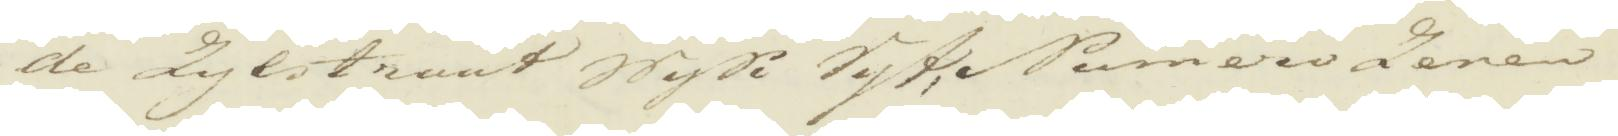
de Zylstraat Wyk Vyf Numero Zeven
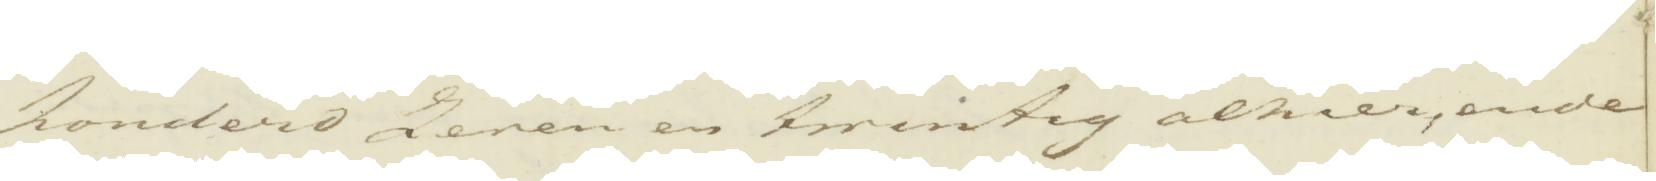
honderd Zeven en twintig alhier, ende
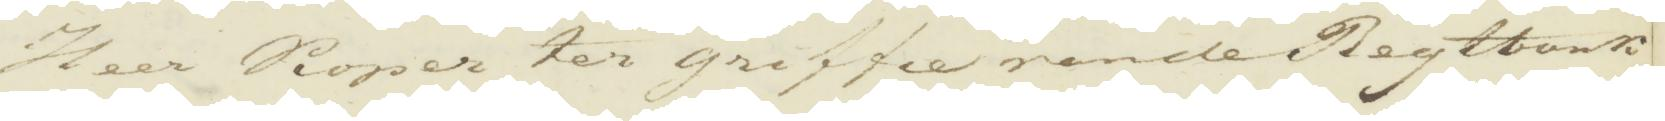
Heer Koper ter griffie van de Regtbank
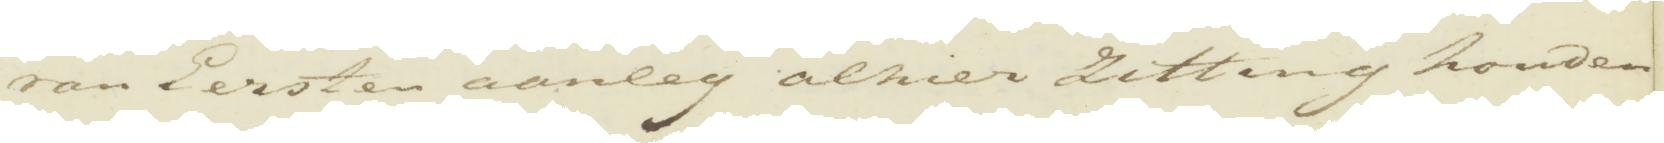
van Eersten aanleg alhier zitting houden
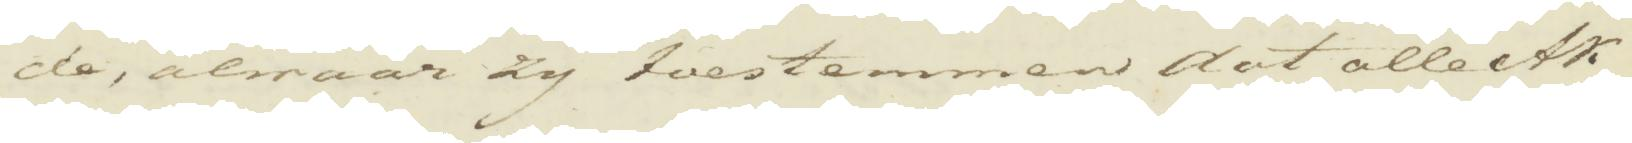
de, alwaar zy toestemmen dat alle Ak
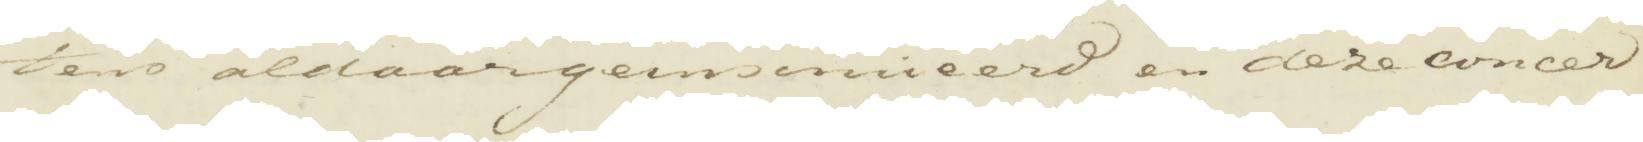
tens aldaar geinsinueerd en deze concer
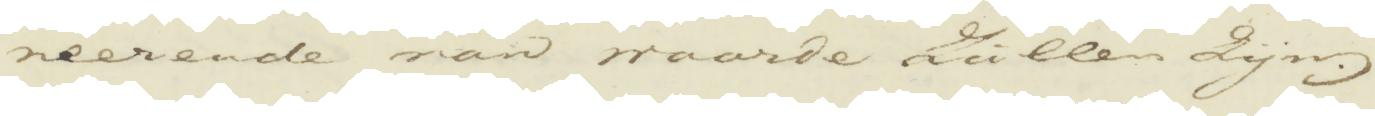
neerende van waarde zullen zijn.
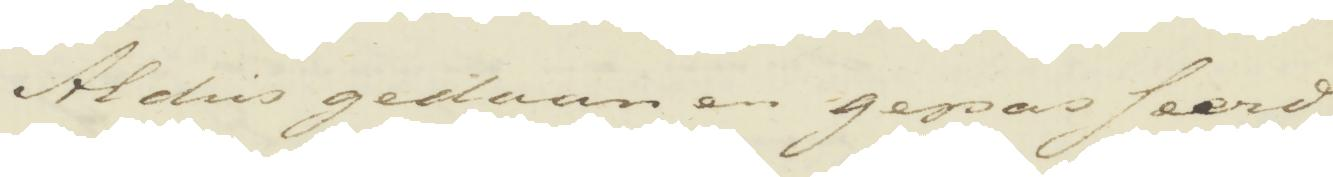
Aldus gedaan en gepasseerd
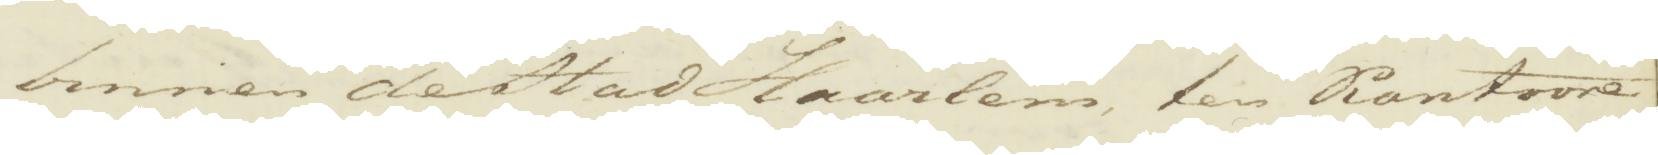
binnen de stad Haarlem, ten Kantoore
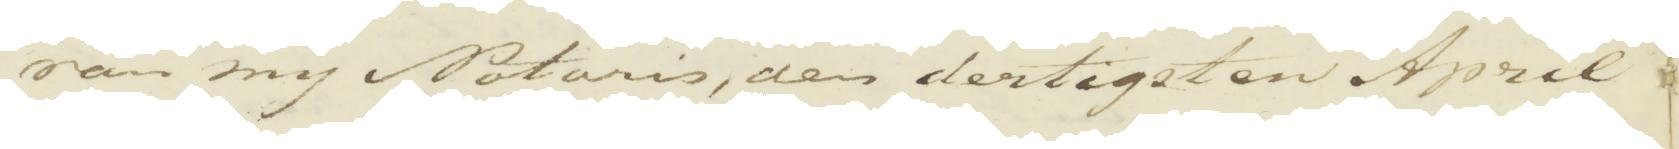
van my Notaris, den dertigsten April
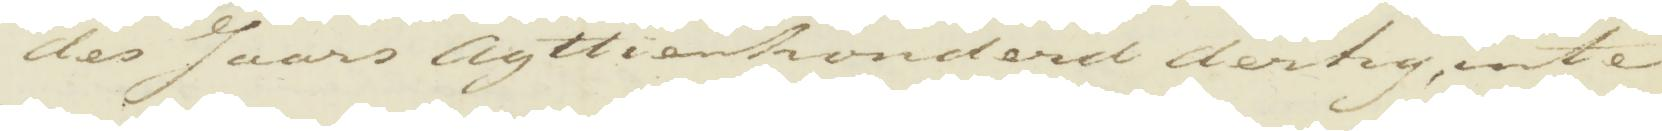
des Jaars Agttienhonderd dertig, inte
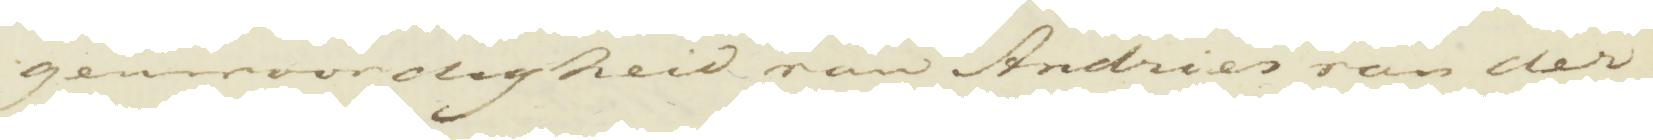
genwoordigheid van Andries van der
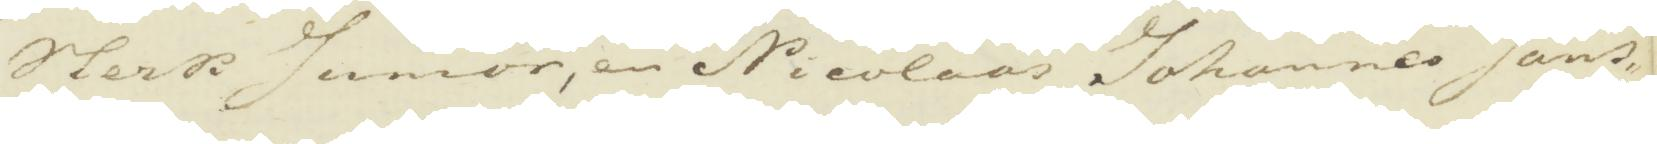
Vlerk Junior, en Nicolaas Johannes Jans„
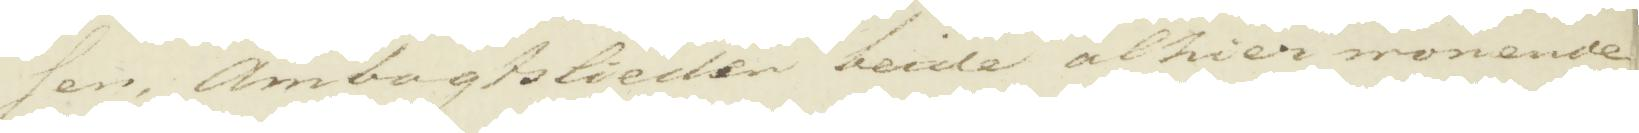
sen, Ambagtslieden beide alhier wonende
